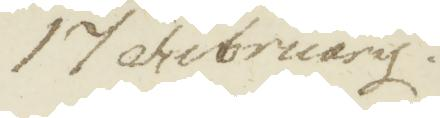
17 February.
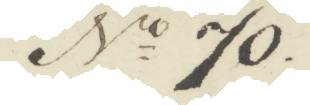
N=o 70.
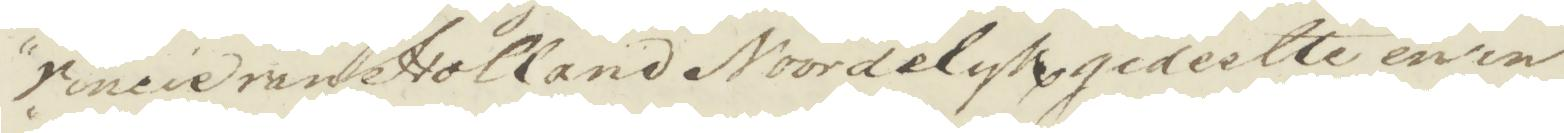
„vincie van Holland Noordelyk gedeelte en in
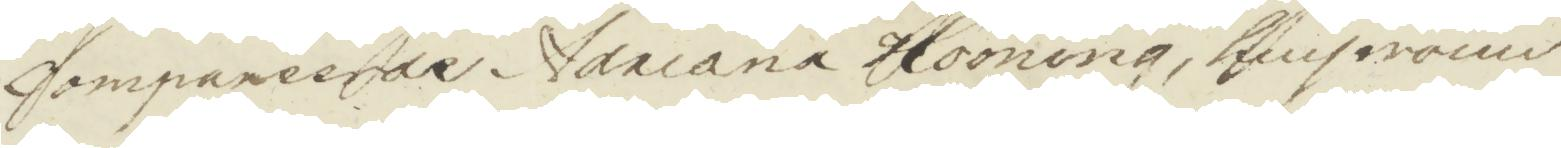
compareerde Adriana Hooning, huisvrouw
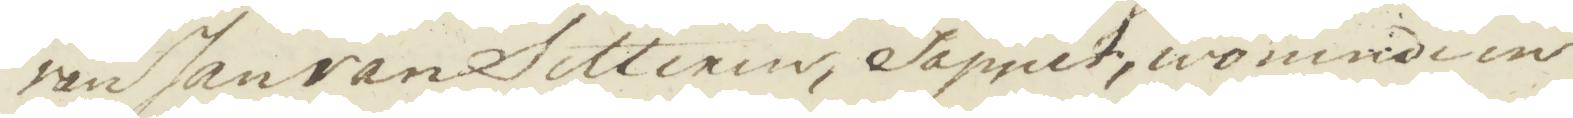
van Jan van Sitteren, Tapper, wonende in
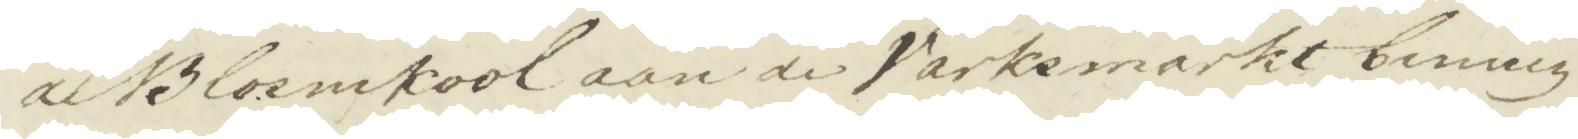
de Bloemkool aan de Varkemarkt binnen
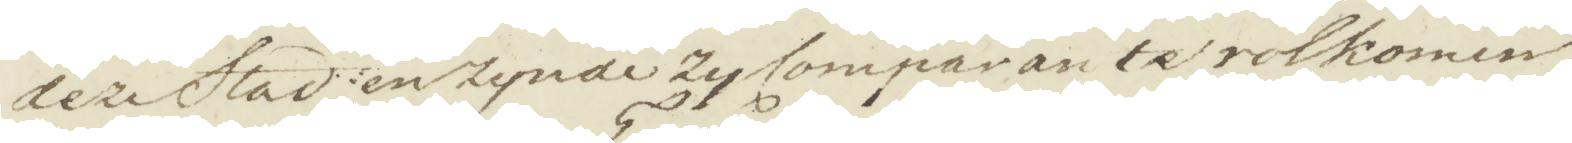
deze Stad en zynde zy Comparante volkomen
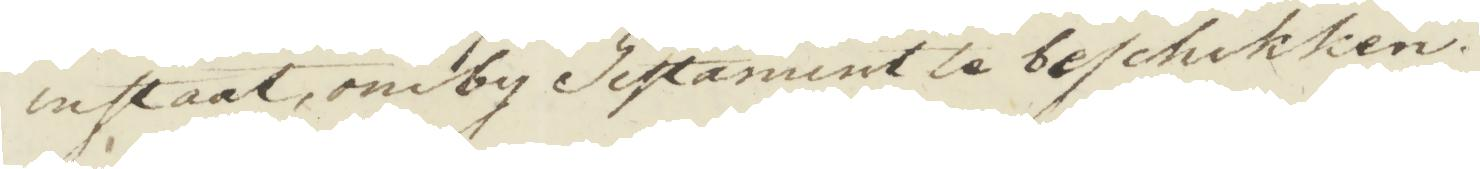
in staat, om by Testament te beschikken.
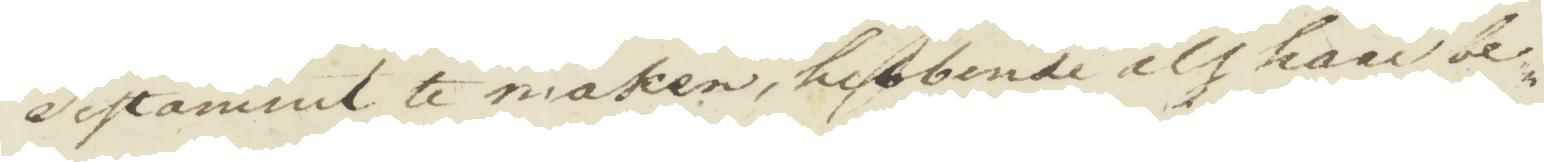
Testament te maken, hebbende als hare be„
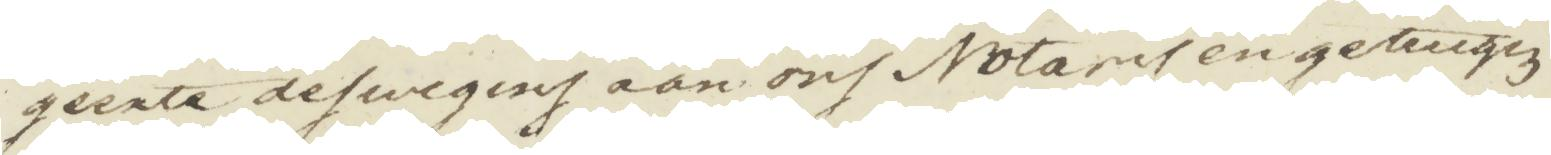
„geerte deswegens aan ons Notaris en getuigen
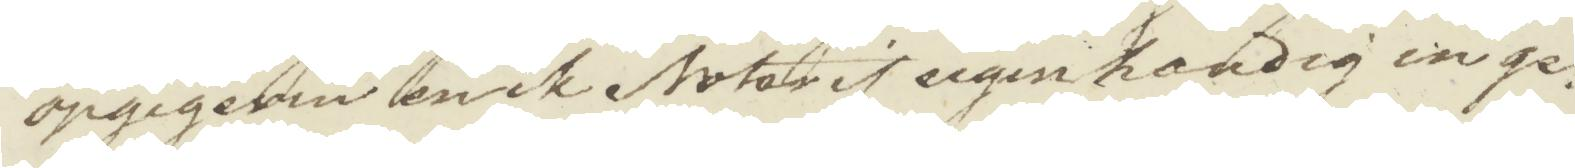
opgegeven en ik Notaris eigenhandig in ge„
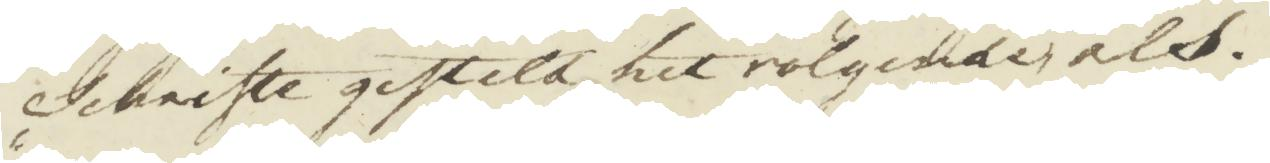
„schrifte gesteld het volgende, als.
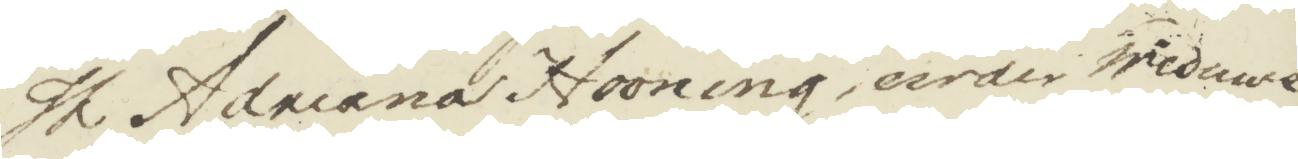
Jk Adriana Hooning, eerder weduwe
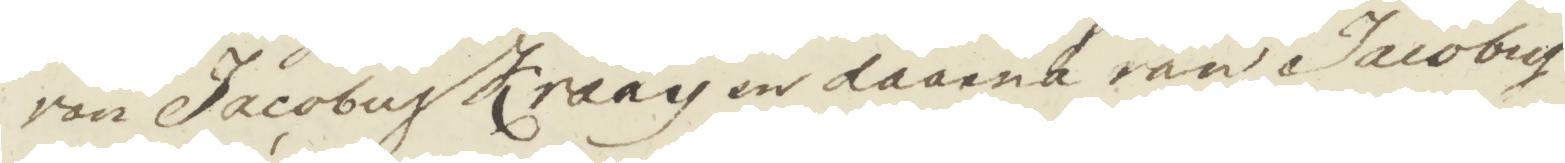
van Iacobus Kraay en daarna van Iacobus
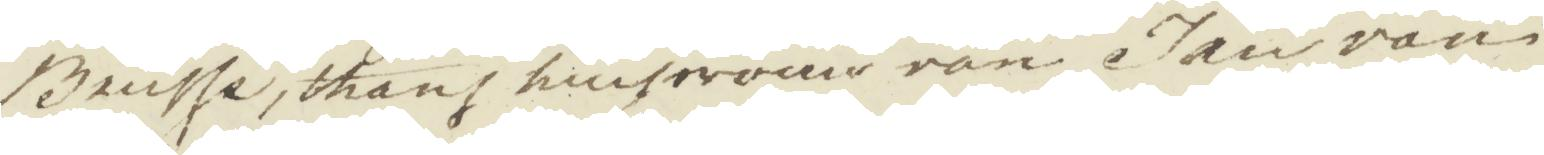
Brussé, thans huisvrouw van Ian van
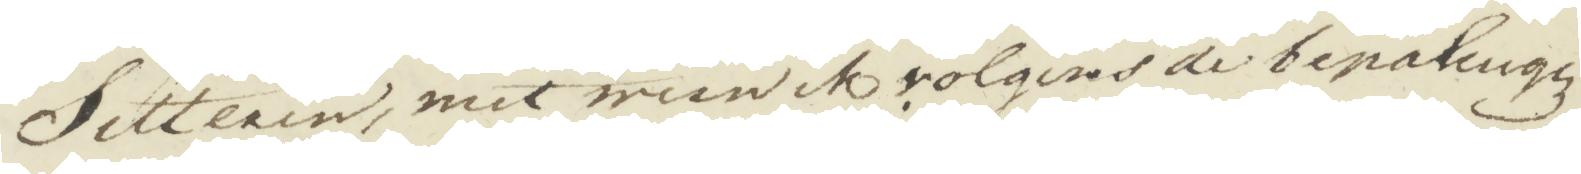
Sitteren, met wien ik volgens de bepalingen
